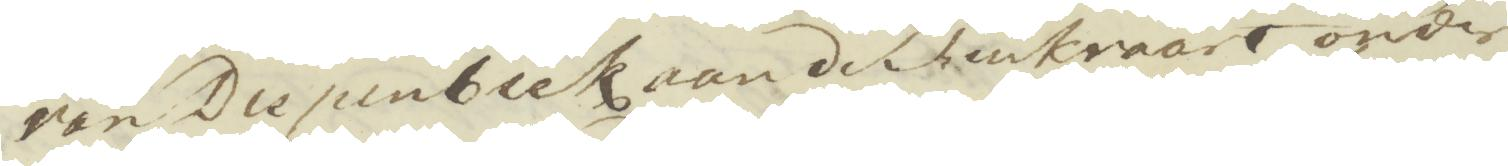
van Diepenbeek aan de Trekvaart onder
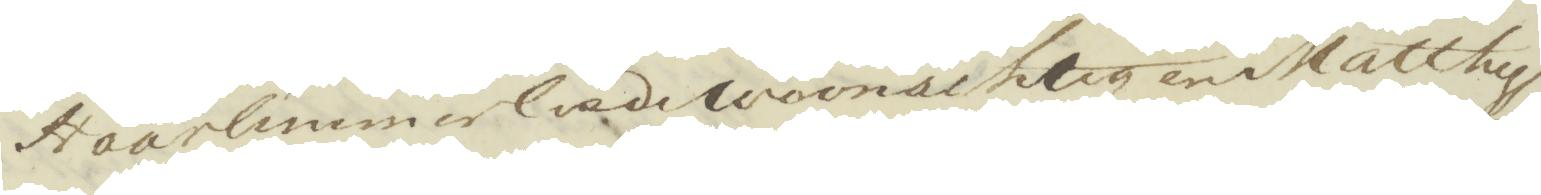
Haarlemmerliede woonachtig en Matthys
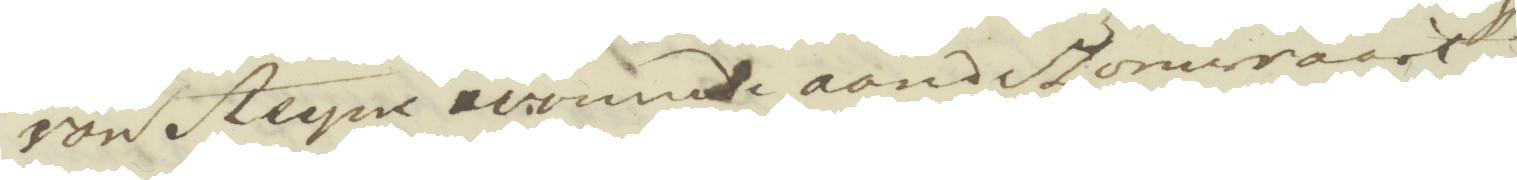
van Steyne wonende aan de Zomervaart
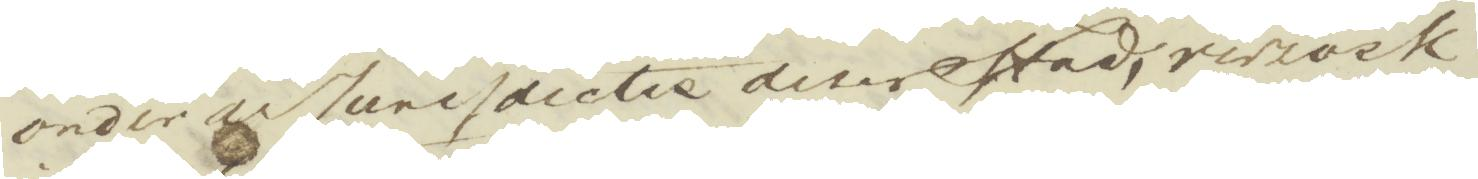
onder de Jurisdictie dezer Stad, verzoek
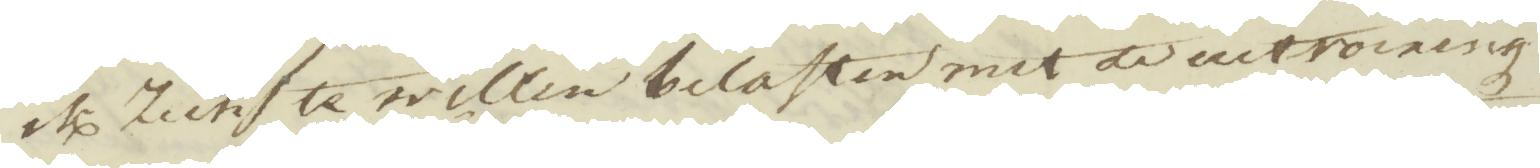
ik hun te willen belasten met de uitvoering
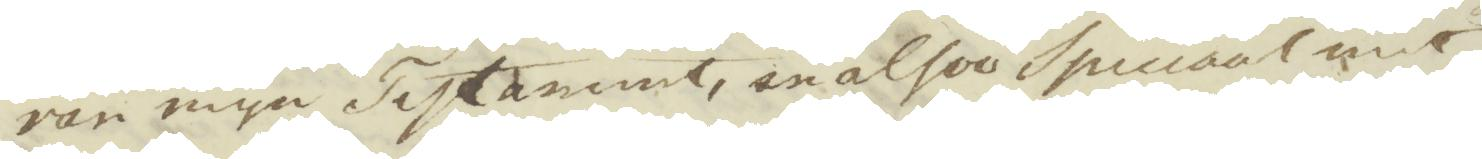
van myn Testament, in alsoo Speciaal met
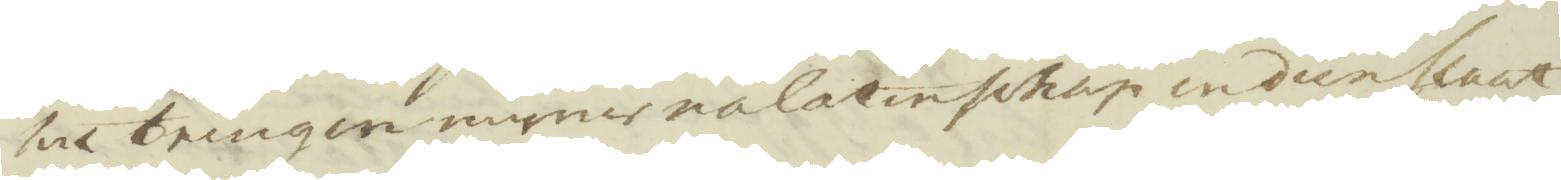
het brengen myner nalatenschap in dien staat
